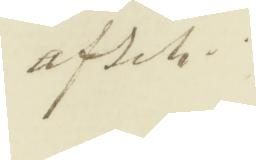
afsch.
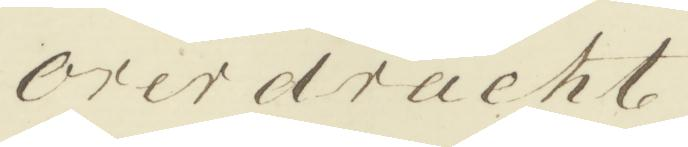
overdracht
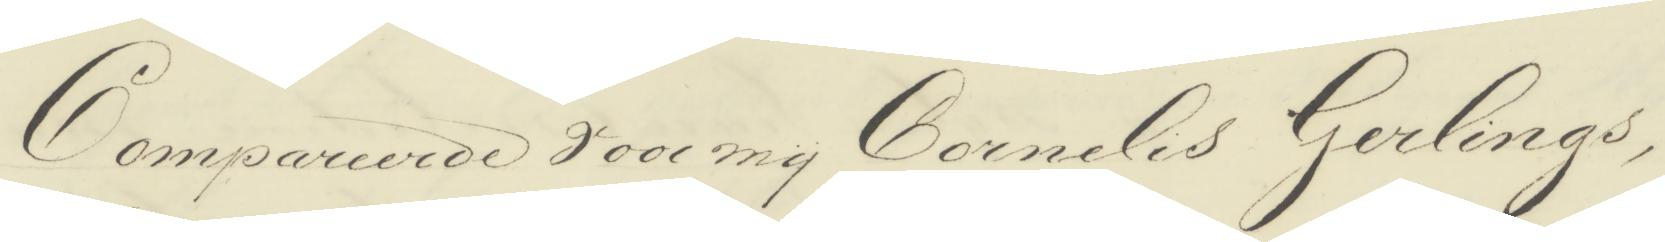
Compareerde voor mij Cornelis Gerlings,
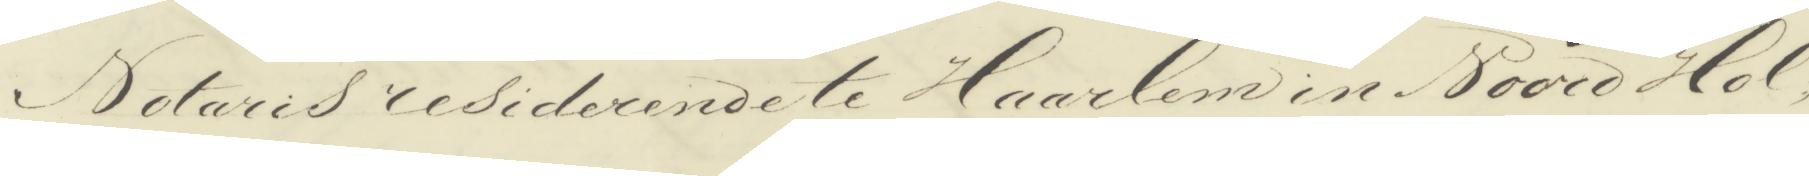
Notaris residerende te Haarlem in Noord Hol,
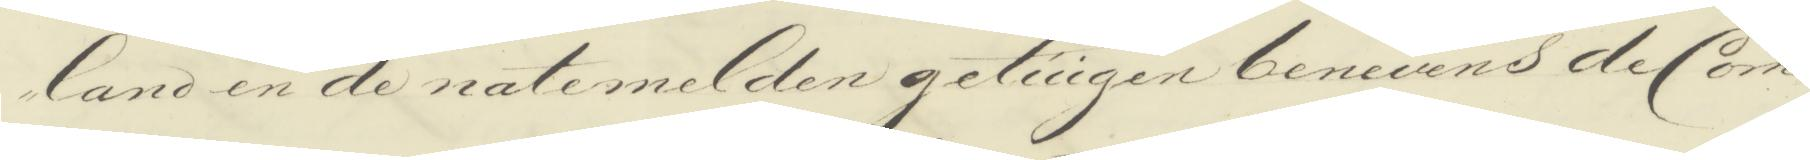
„land en de natemelden getuigen benevens de Com
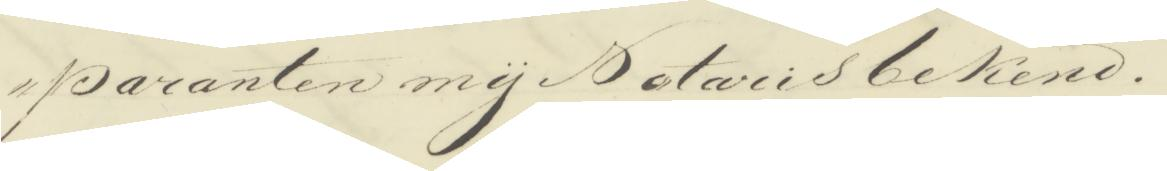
„paranten mij Notaris bekend.
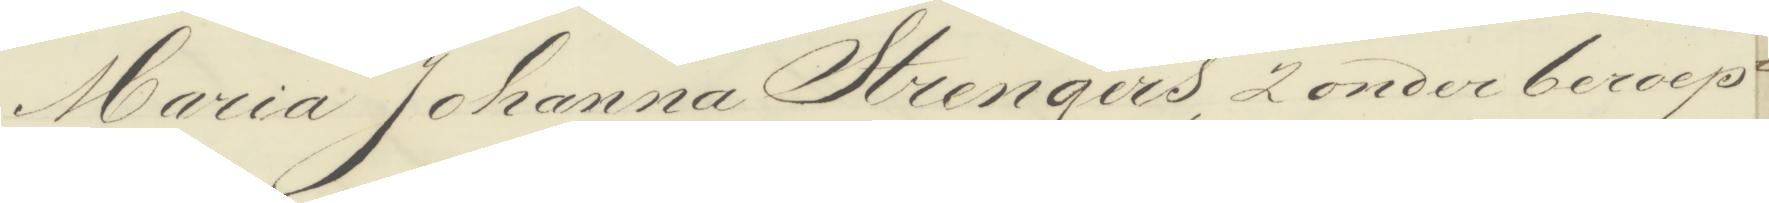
Maria Johanna Strengers, zonder beroep
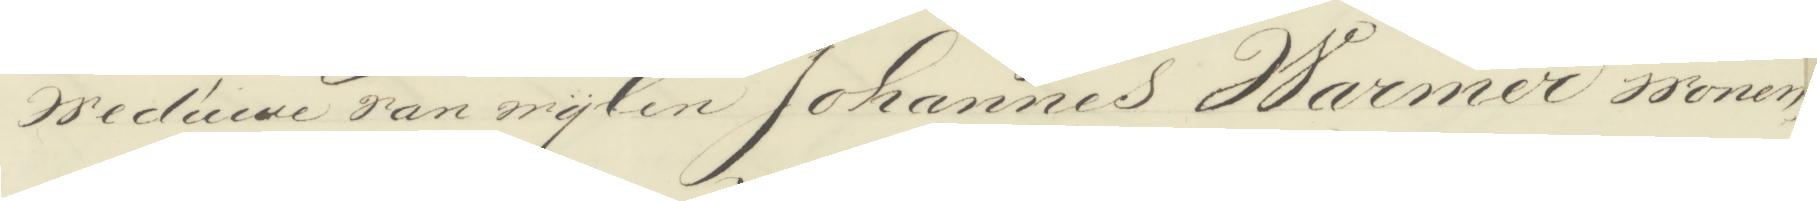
Weduwe van wijlen Johannes Warmer Wonen„
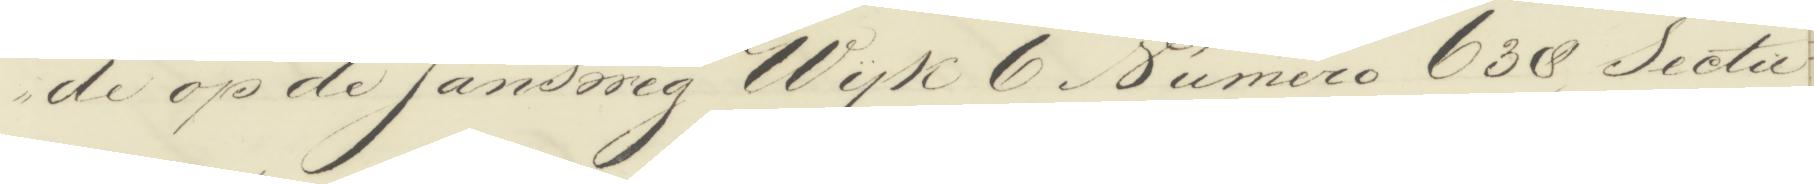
„de op de Jansweg Wijk 6 Numero 638, Sectie
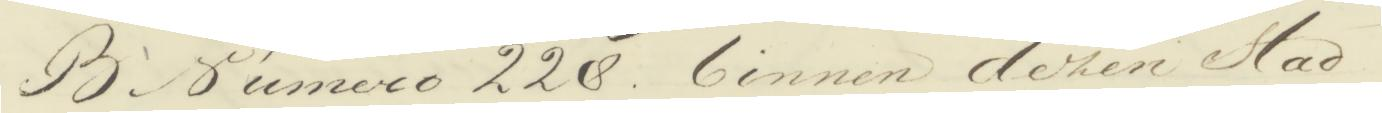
B Numero 228. binnen dezen stad
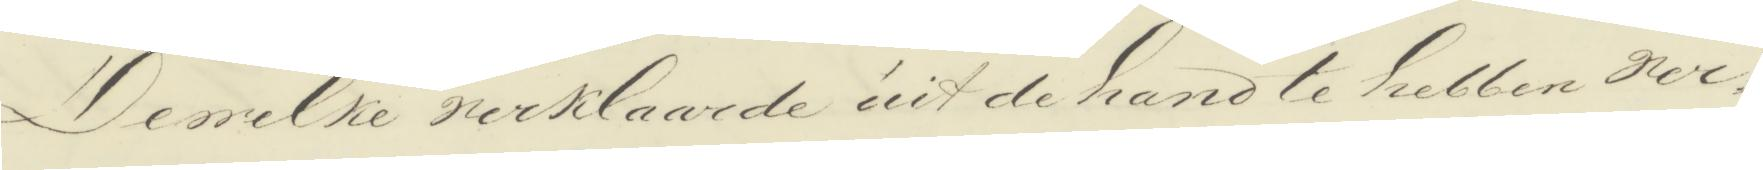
Dewelke verklaarde uit de hand te hebben ver„
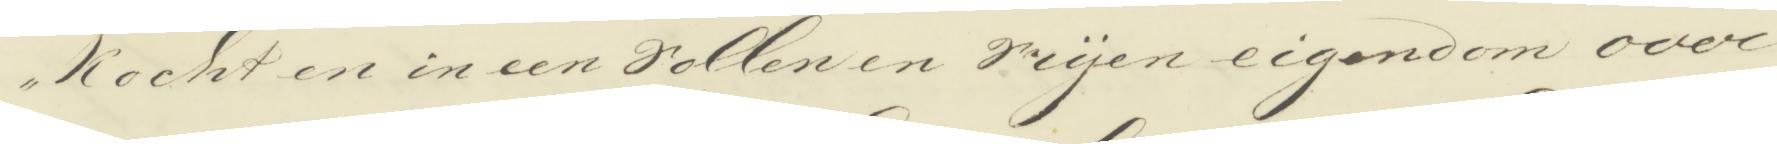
„kocht en in een vollen en vrijen eigendom over
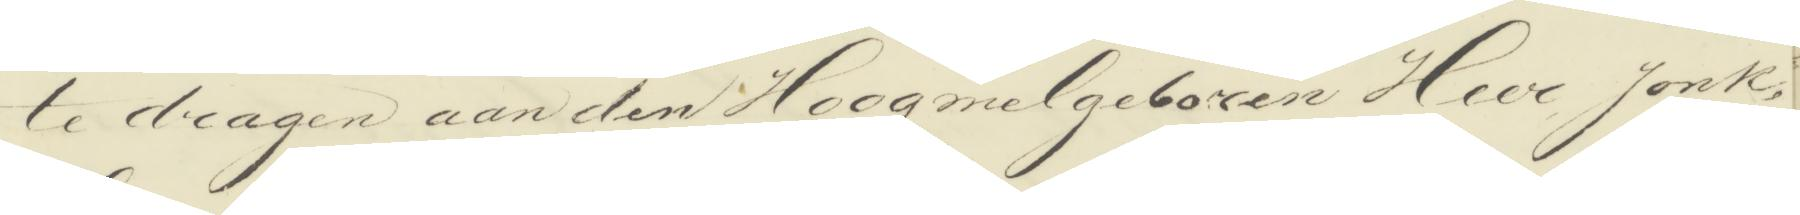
te dragen aan den Hoogwelgeboren Heer Jonk„
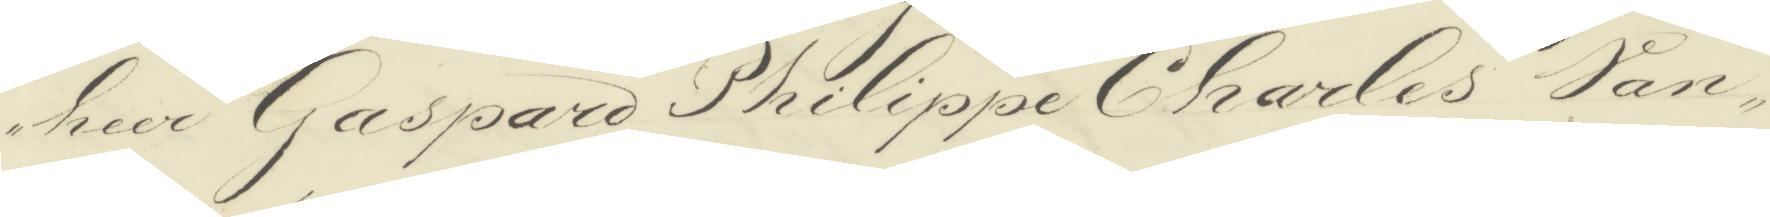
„heer Gaspard Philippe Charles Van„
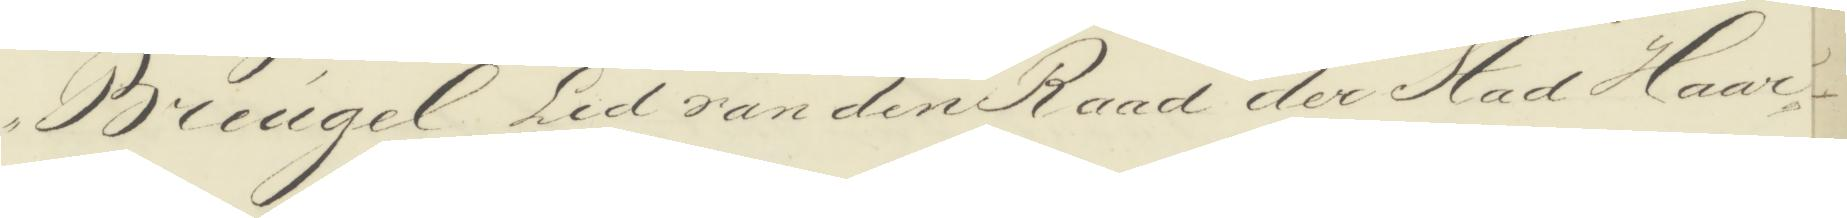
„Breugel Lid van den Raad der Stad Haar„
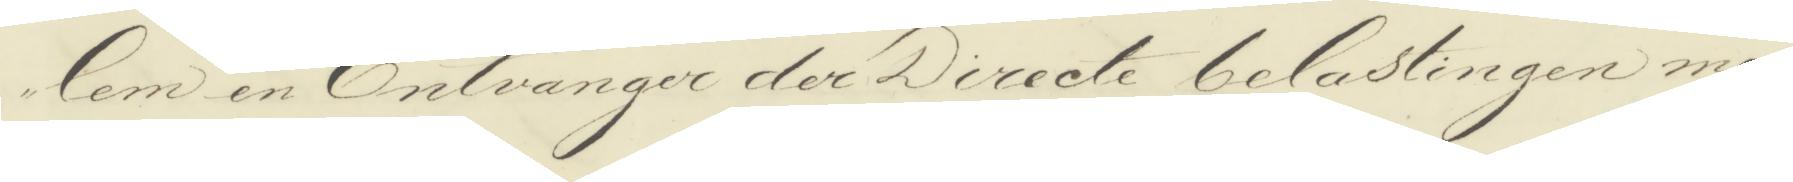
„lem en Ontvanger der Directe belastingen me
